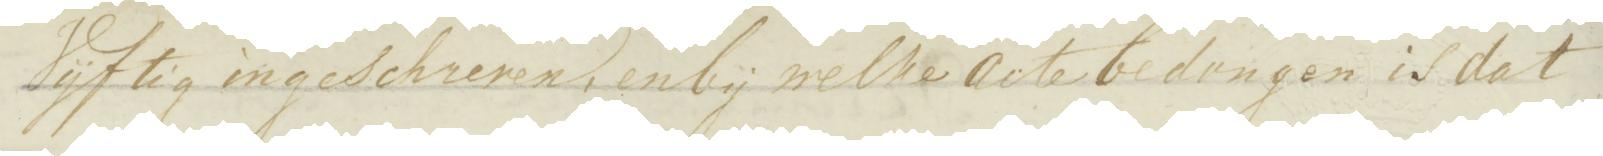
Vijftig ingeschreven, en bij welke acte bedongen is dat
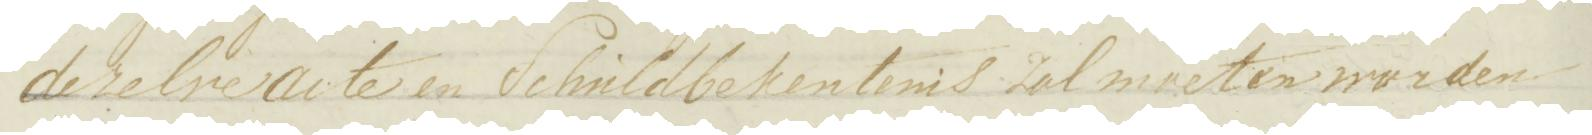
dezelve acte en Schuldbekentenis zal moeten warden
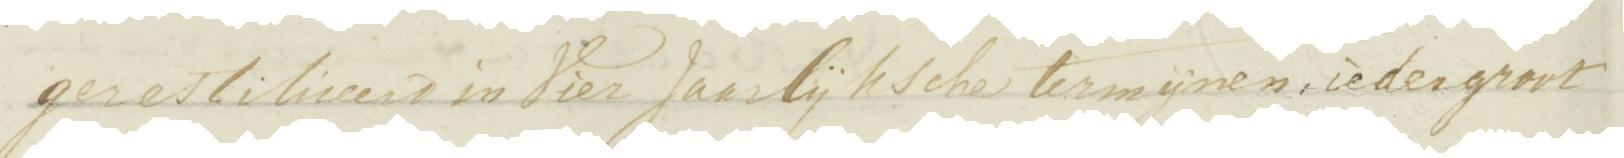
gerestitueerd in Vier Jaarlijksche termijnen: ieder groot
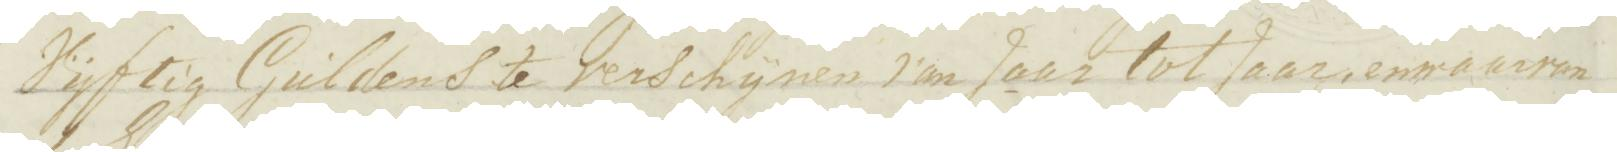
Vijftig Guldens te verschijnen van Jaar tot Jaar, en waarvan
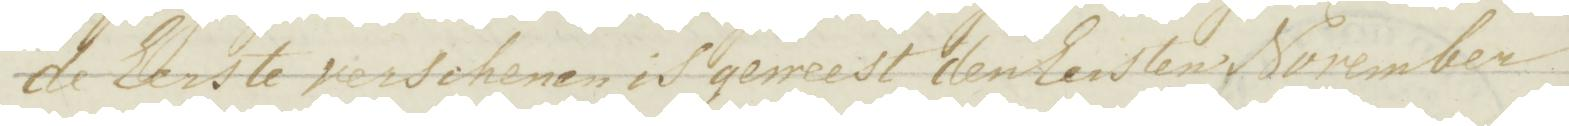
de Eerste verschenen is geweest den Eersten November
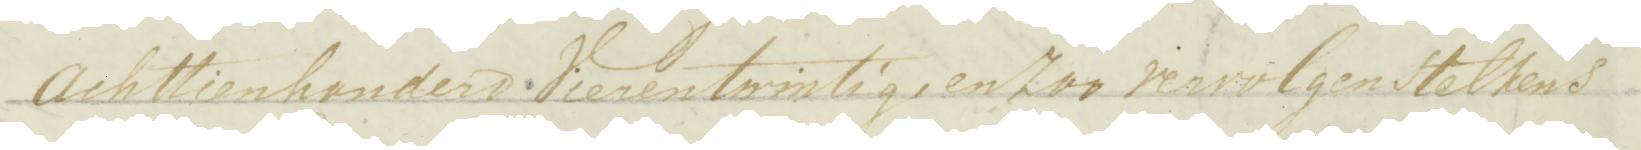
Achttienhonderd Vierentwintig, en zoo vervolgens telkens
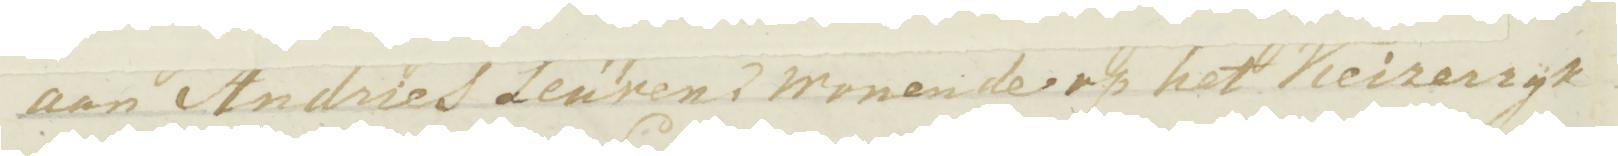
aan Andries Leuven, wonende op het Keizerrijk
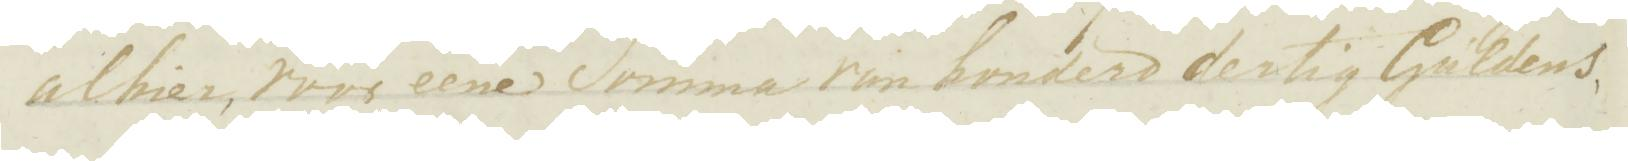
alhier, voor eene Somma van honderd dertig Guldens,
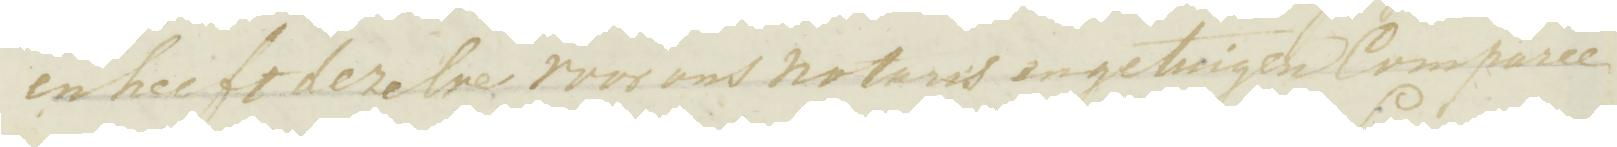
en heeft dezelve voor ons notaris en getuigen Comparee
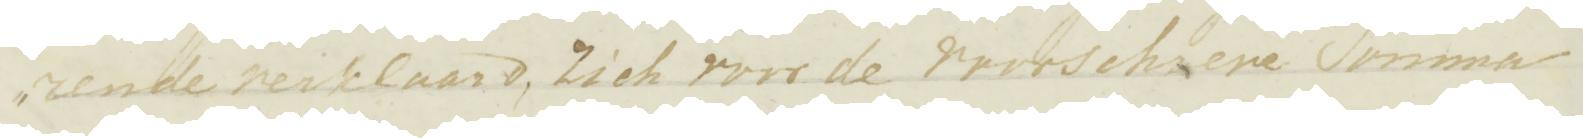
„rende verklaard, zich voor de voorschreve Somma
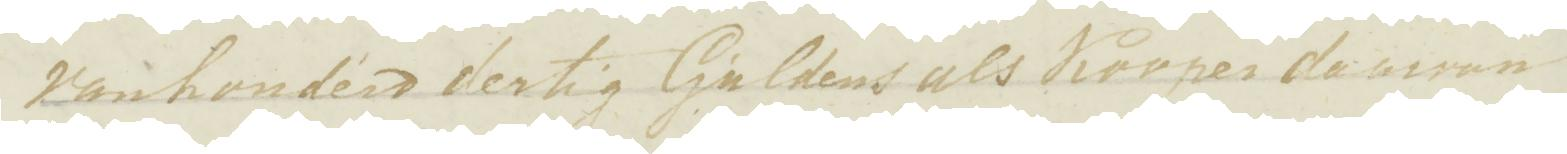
van honderd dertig Guldens als Kooper daarvan
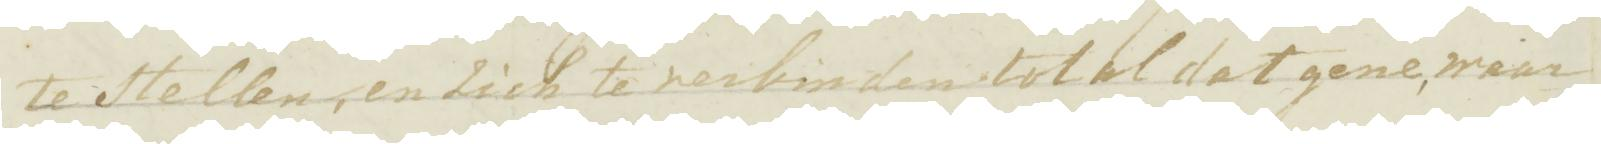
te stellen, en zich te verbinden tot al dat gene, waar
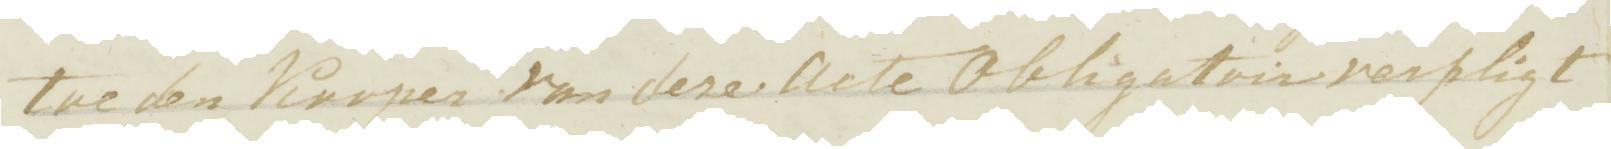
toe den Kooper van deze Acte obligatoir verpligt
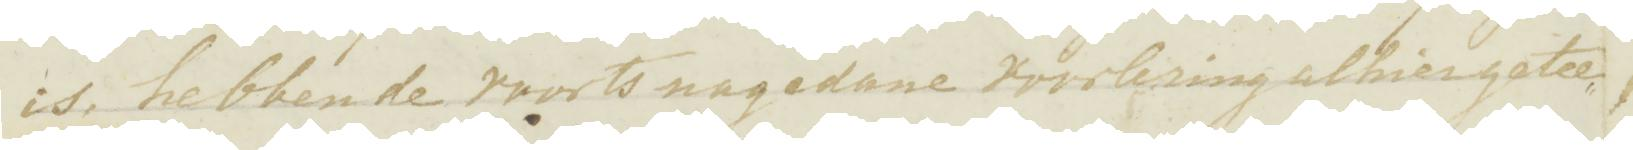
is, hebbende voorts nagedane voorlezing alhier getee„
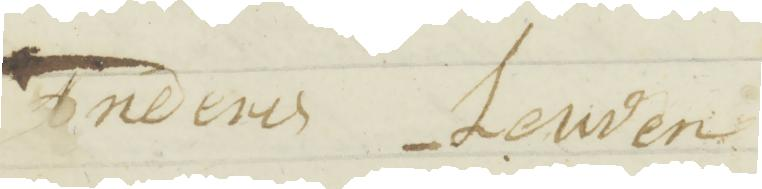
Anderis Leuven
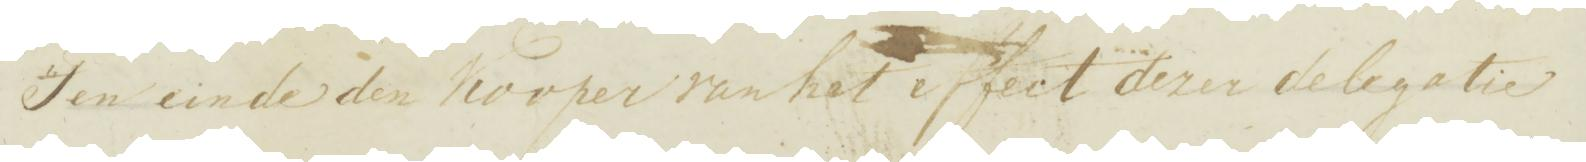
Ten einde den Kooper van het effect dezer delegatie
